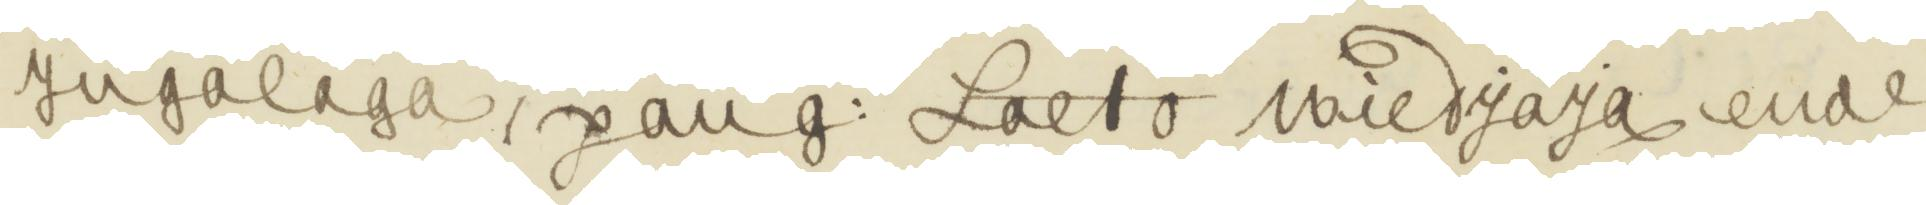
Ingalaga, pang: soeto wiedjaja ende
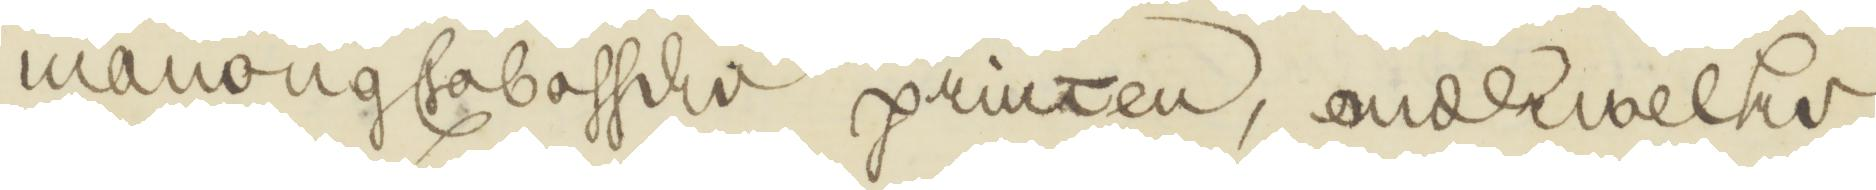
manongcobossche princen, onderwelke
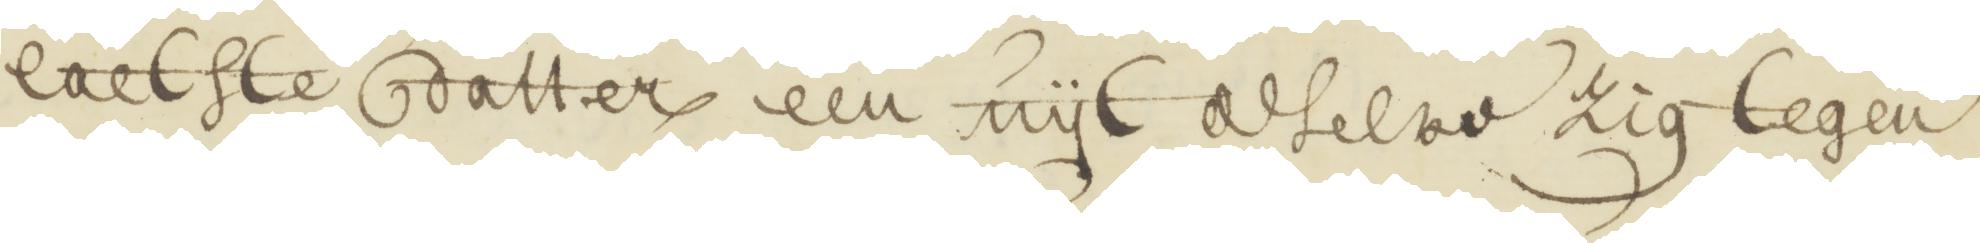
laetste datter een uijt deselve zig tegen
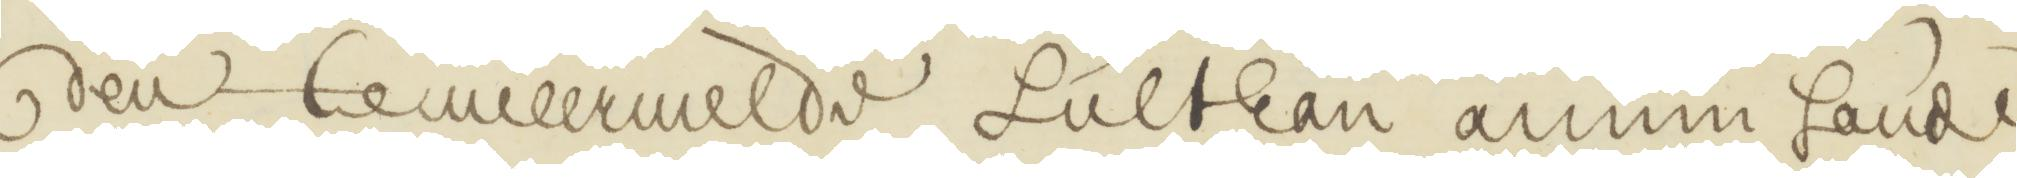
den temeeermelde sulthan anum soude
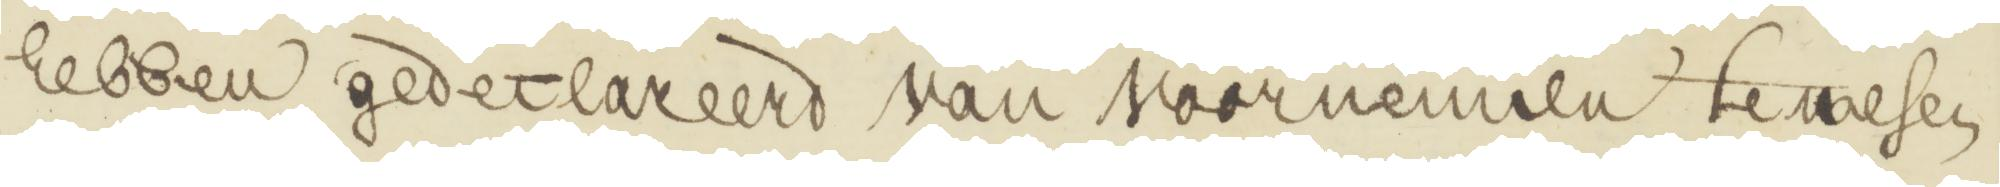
hebben gedeclareerd van voornemen te wesen
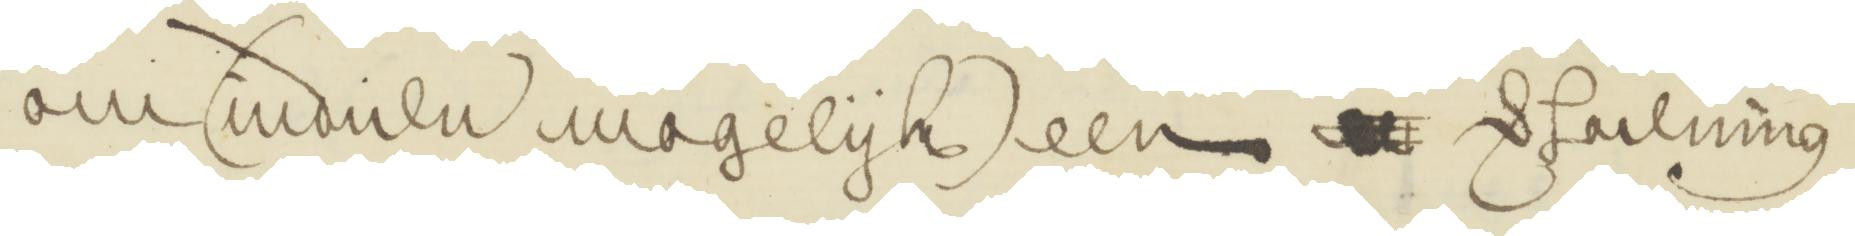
om (indien mogelijk) een een versoening
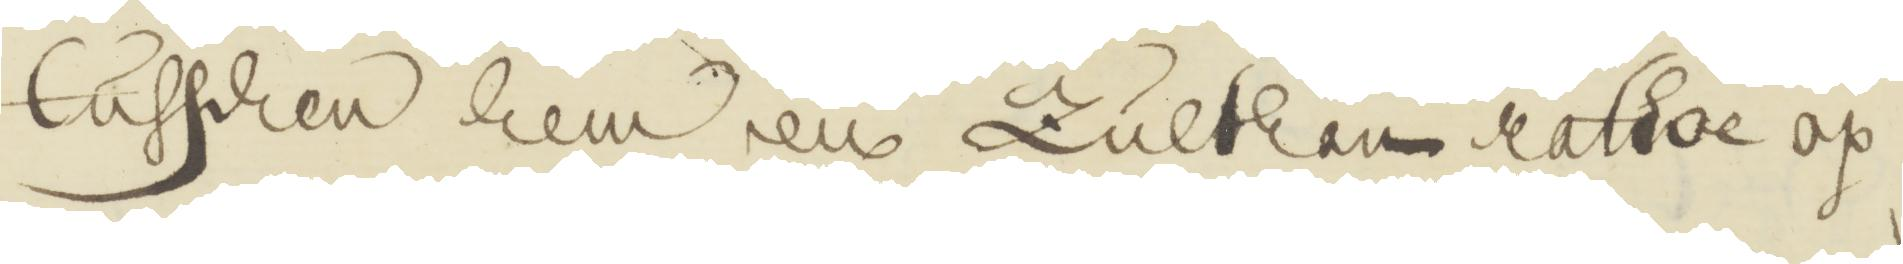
tusschen hem en zulthan rathoe op
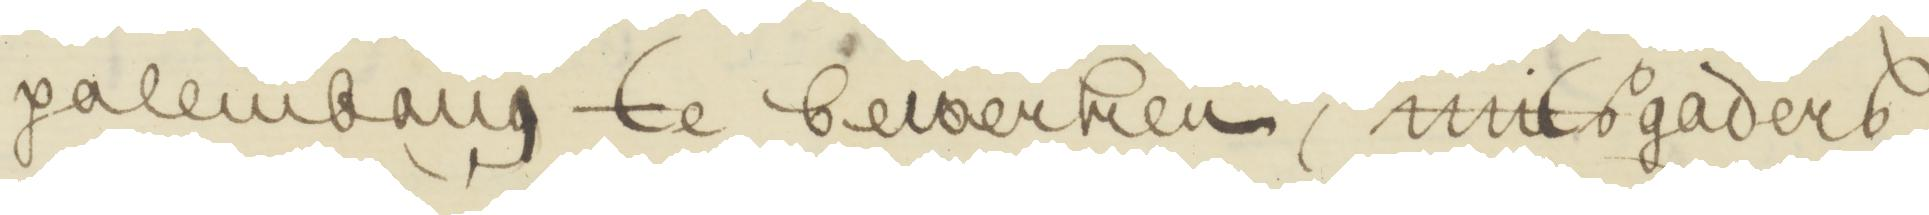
palembang te bewerken, mitsgaders
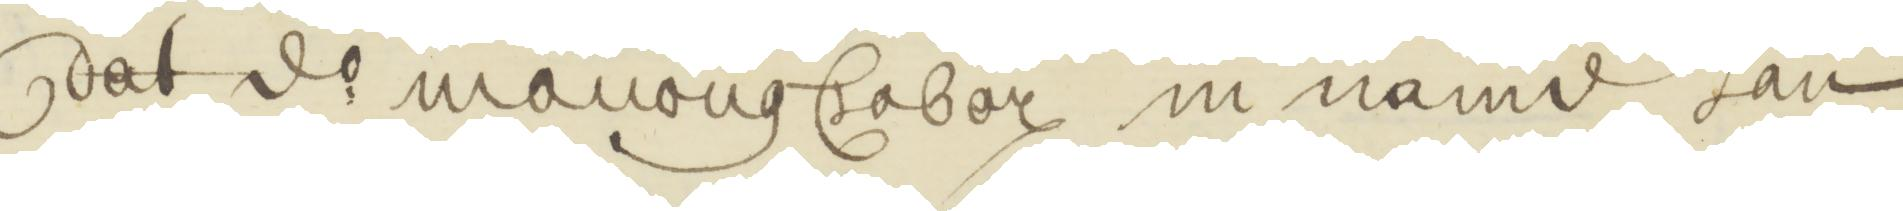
dat e:o manongcobor in name Jan
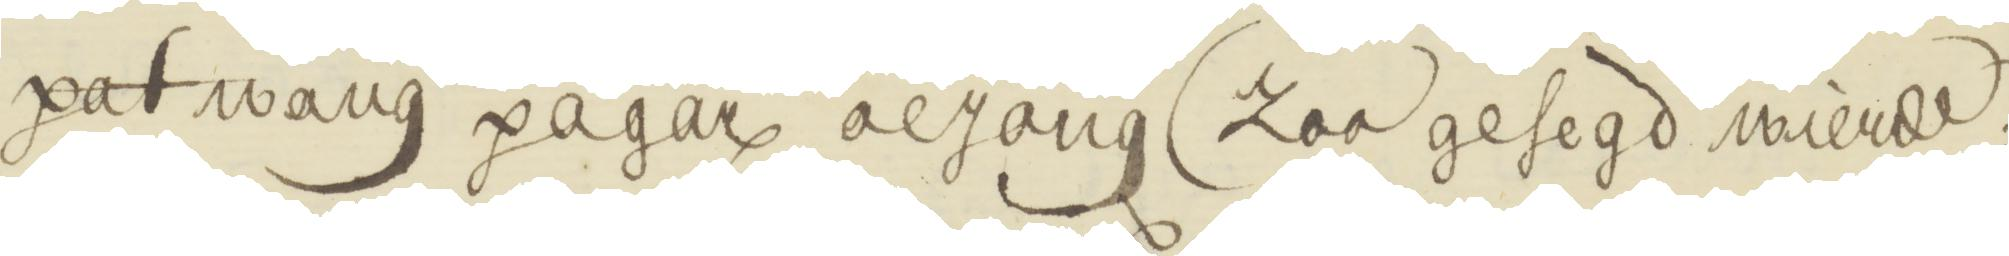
patnang pagar aljang (zoo gesegd wierde:)
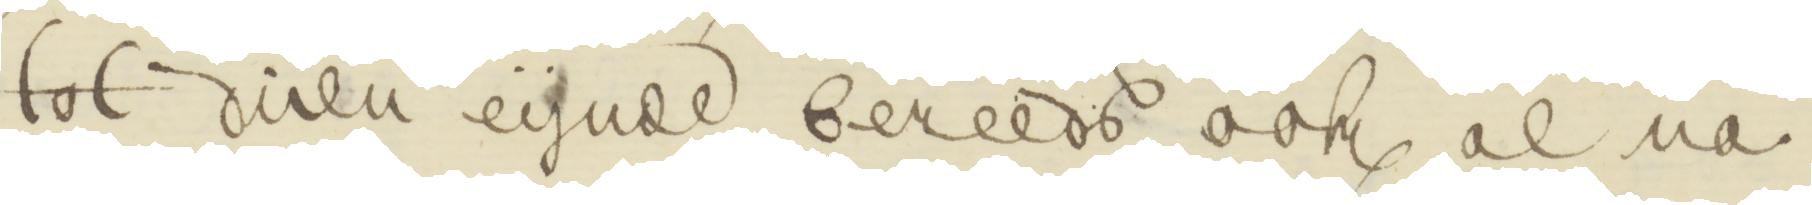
tot dien eijnde bereeds ook al na
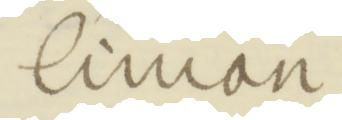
liman
